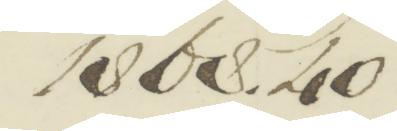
1868.40
